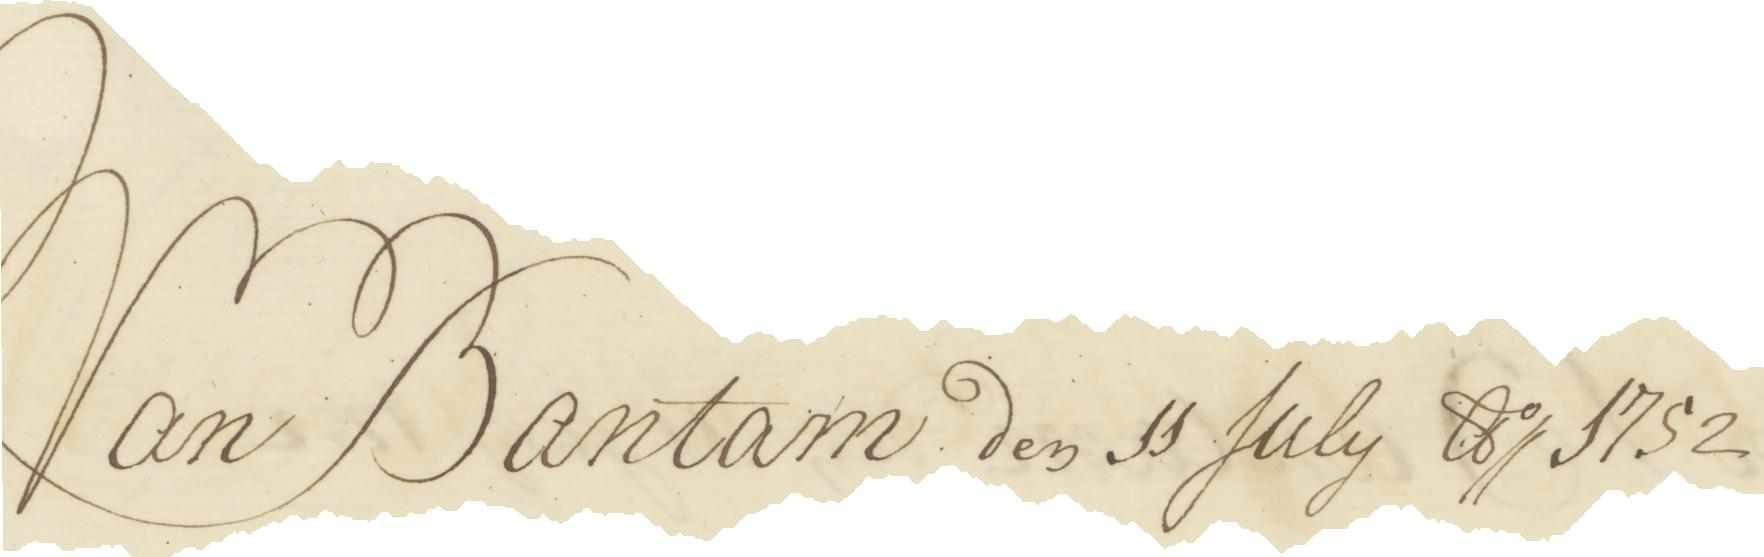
Van Bantam den 11 July A„o 1752
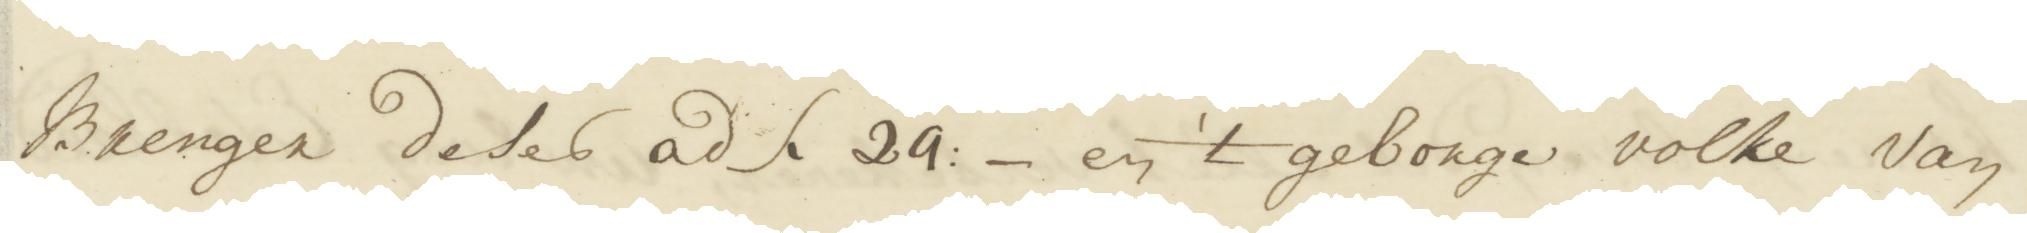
Brenger deses ad ƒ 24: — en ’t geborge volke van
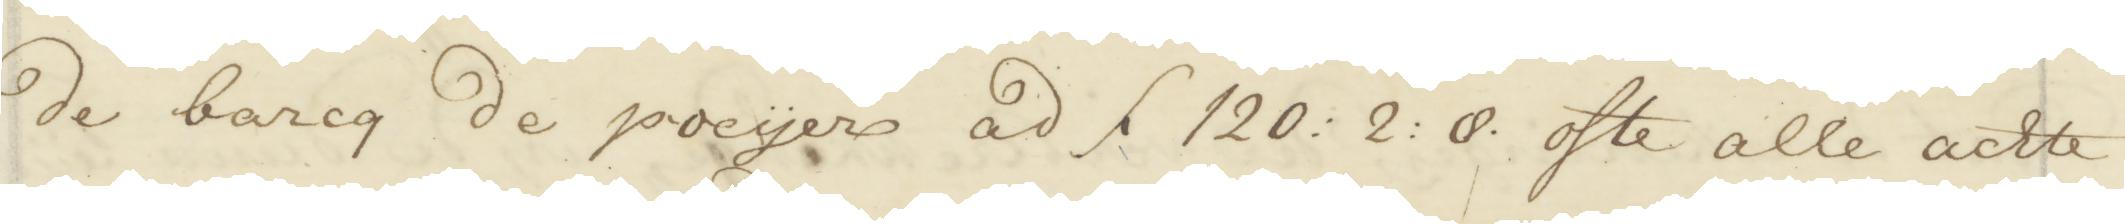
de barcq de poeijer ad ƒ 120:2:8. ofte alle achte
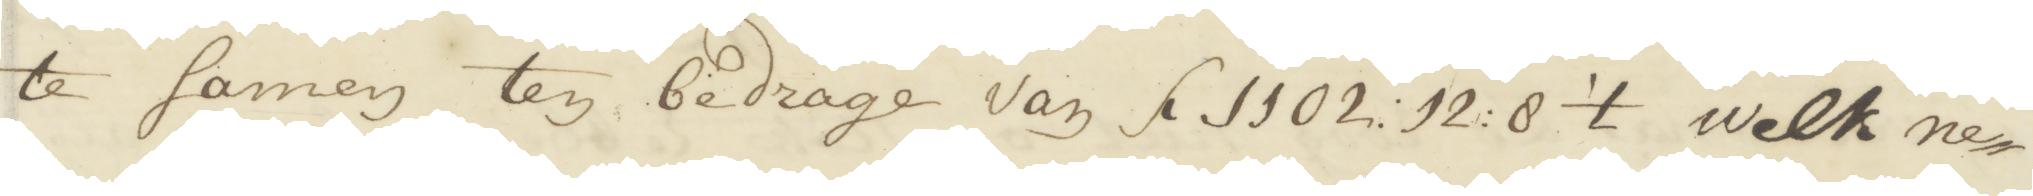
te samen ten bedrage van ƒ 1102:12:8 ’t welk ne„
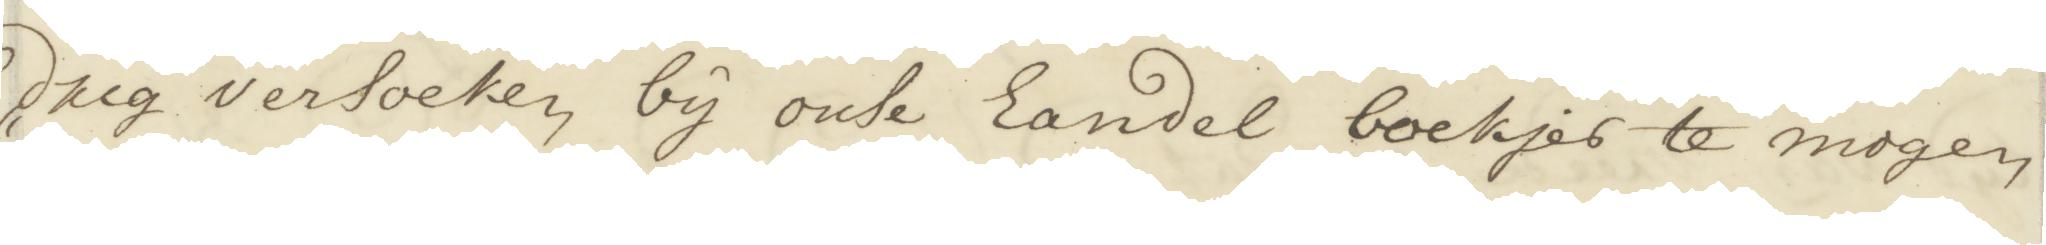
„drig versoeken bij onse handel boekjes te mogen
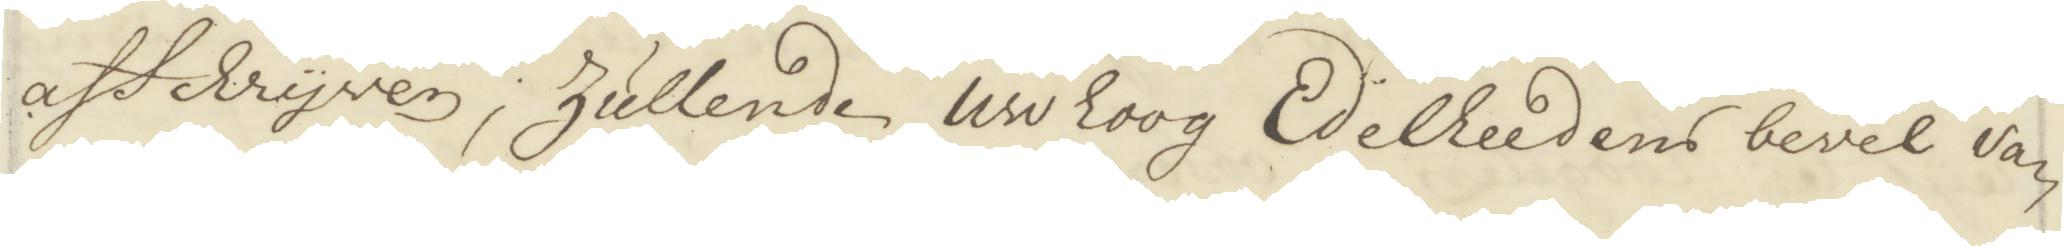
afschrijven; zullende uw hoog Edelheedens bevel van
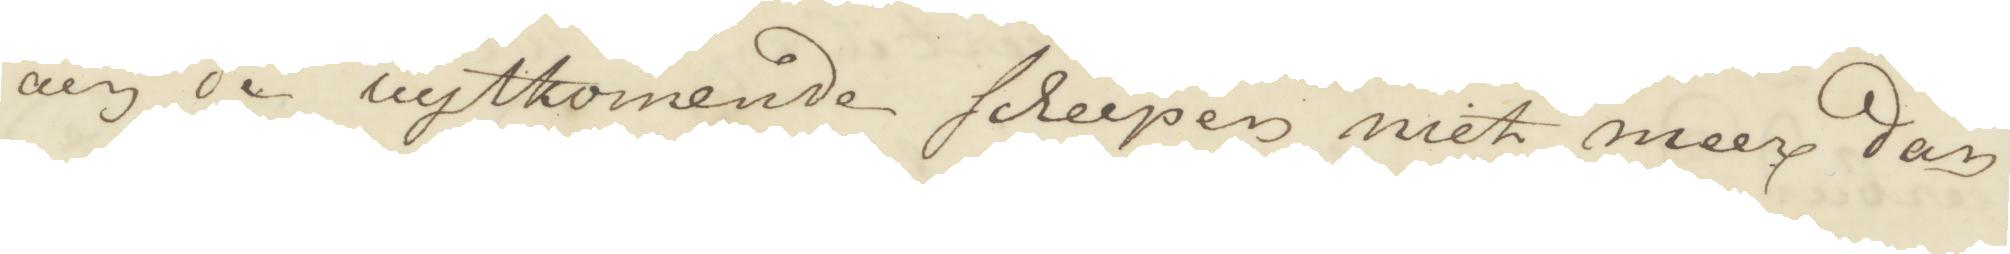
aen de uytkomende scheepen niet meer dan
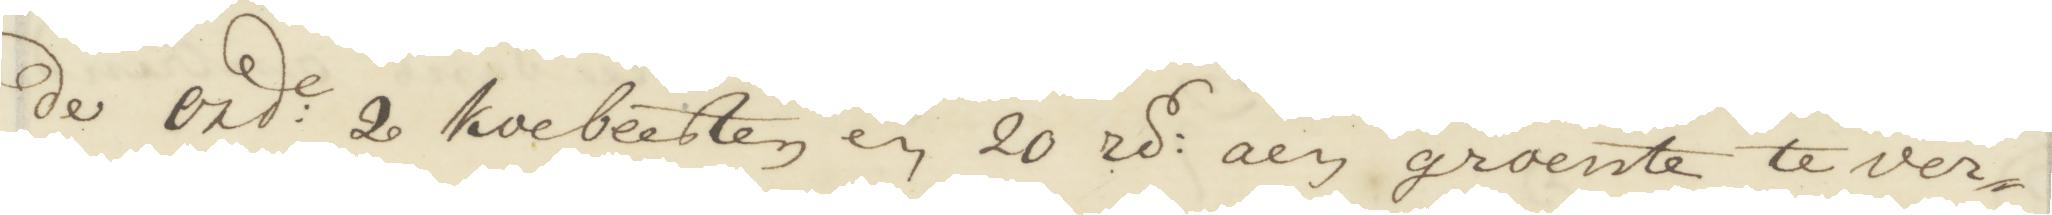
de ord:e 2 koebeesten en 20 rd:s aen groente te ver=
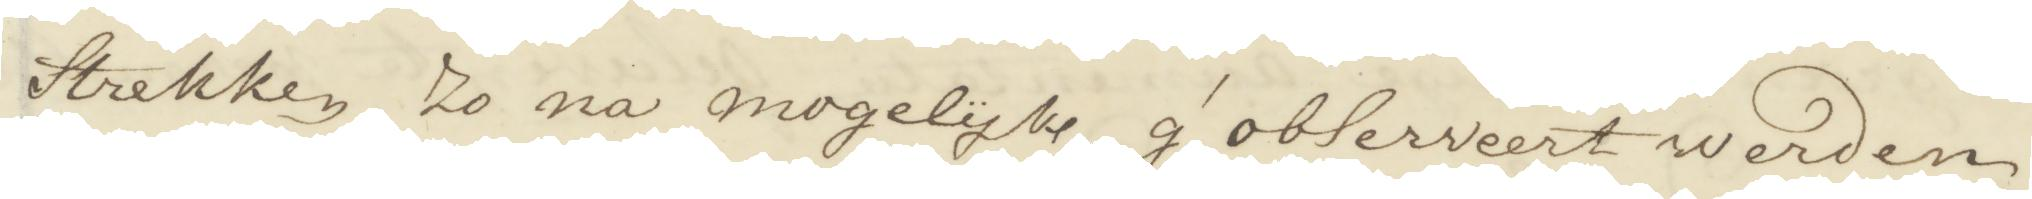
strekken, zo na mogelijk g'observeert werden
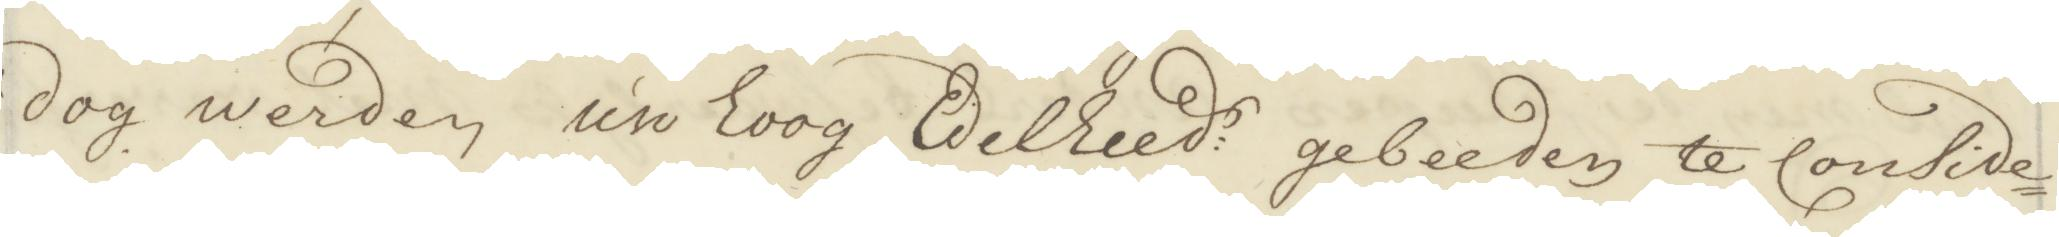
dog werden uw hoog Edelheed:s gebeeden te Conside=
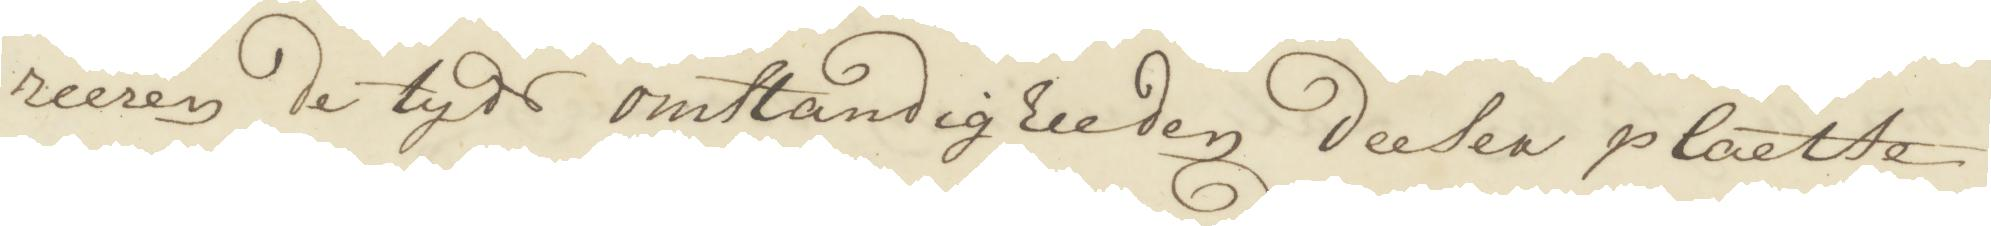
reeren de tyds omstandigheeden deeser plaetse
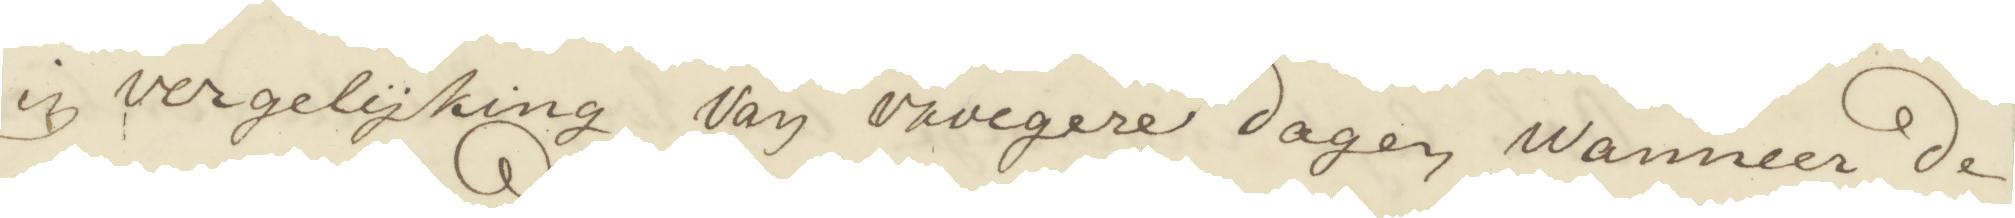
in vergelijcking van vroegere dagen wanneer de
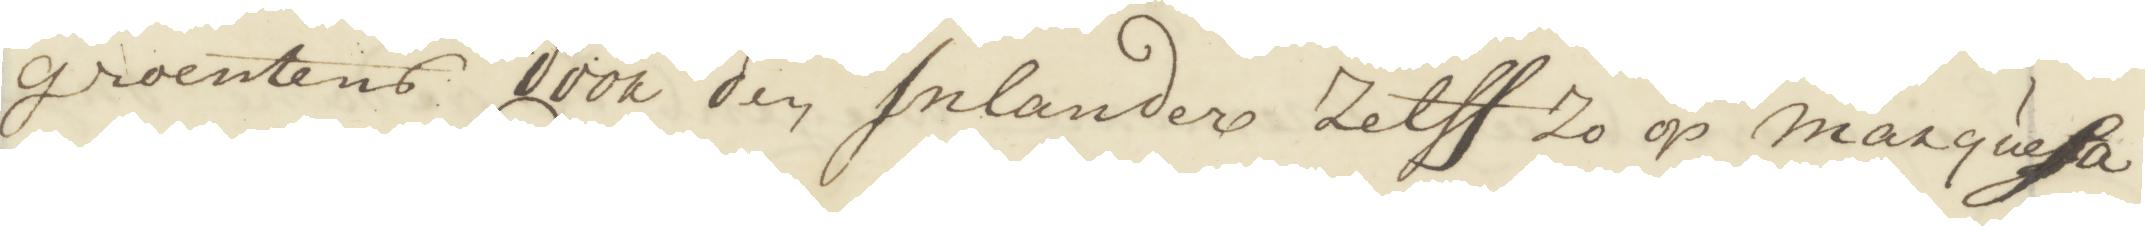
groentens door den Inlander zelff zo op marquesa
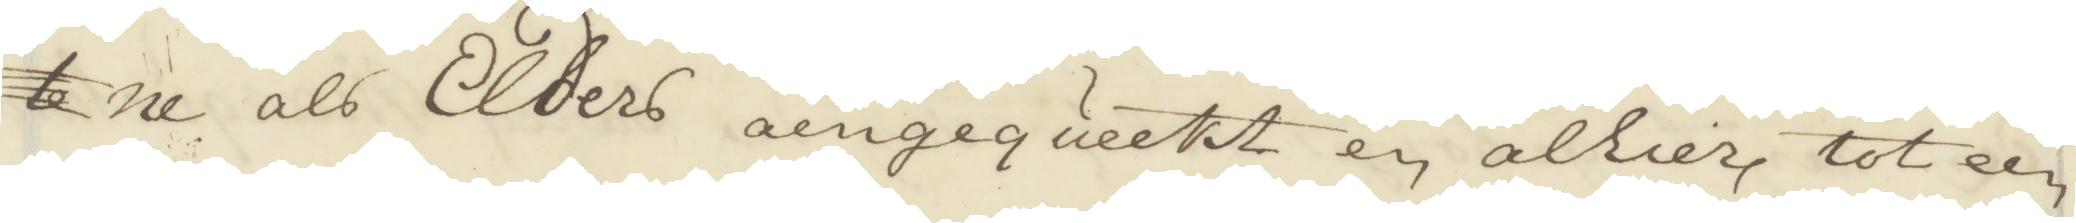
te ne als Elders aengequeekt en alhier tot een
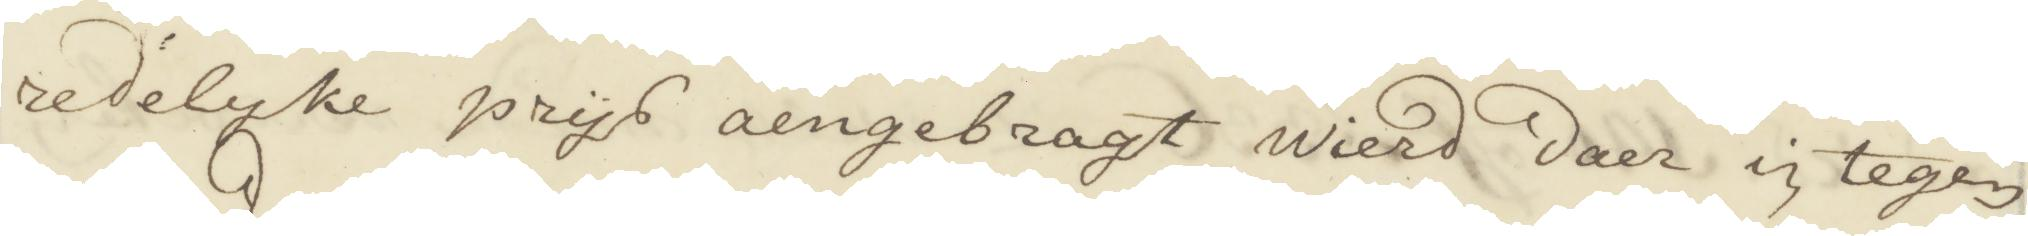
redelyke prijs aengebragt wierd daer in tegen
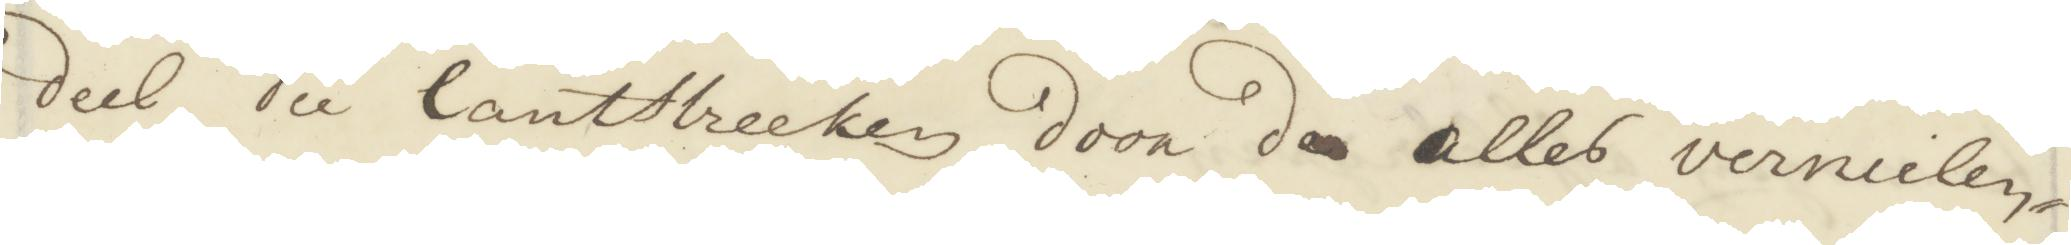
deel die lantstreeken door de alles vernielen„
